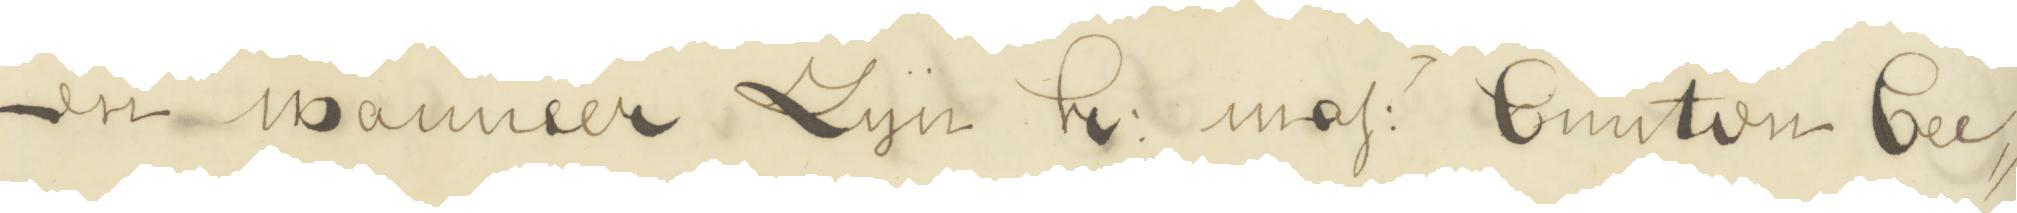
en wanneer Zijn k: maj:' buuten bee„
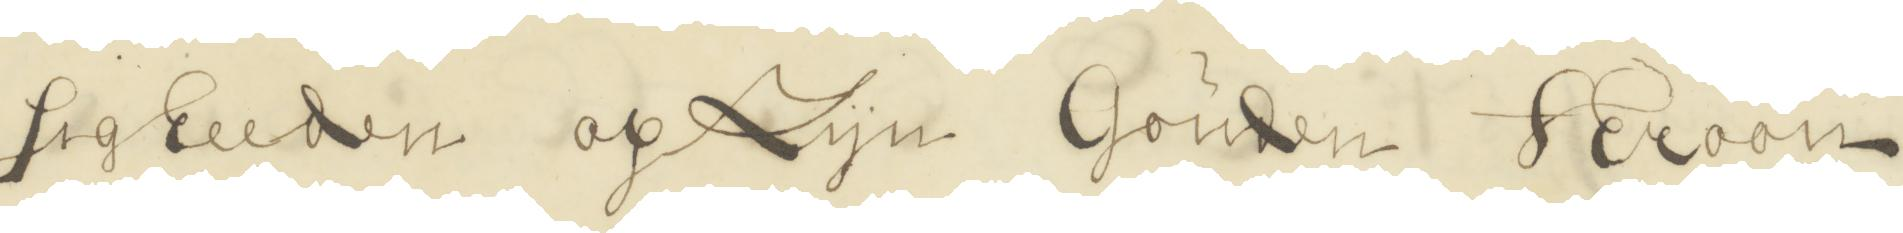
sigheeden op Zijn Gouden throon
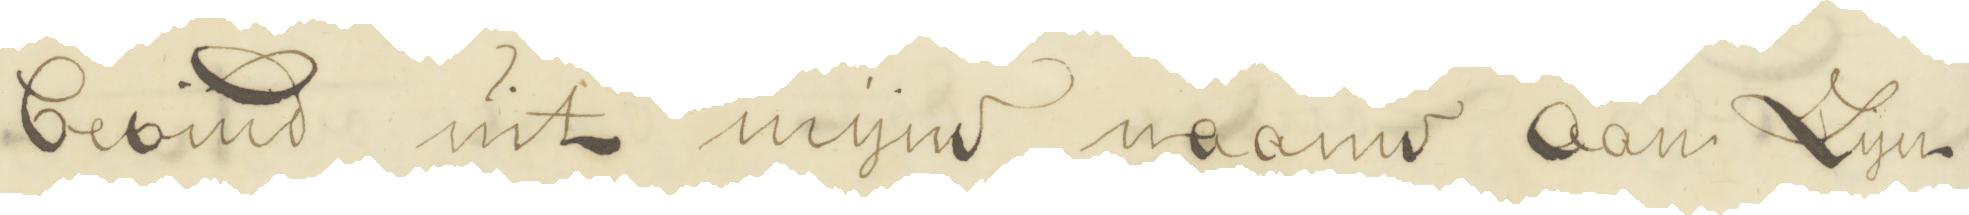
bevind uit mijne naame aan Zijn
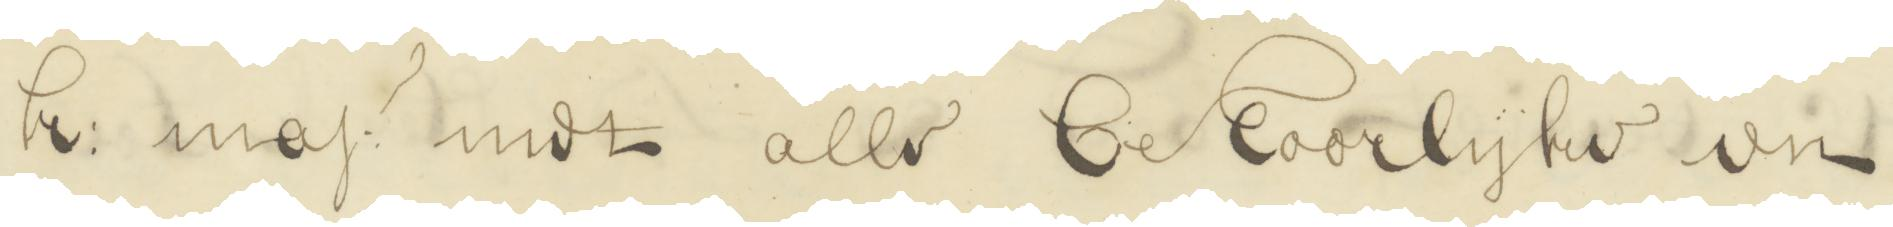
k: maj:' met alle behoorlijke en
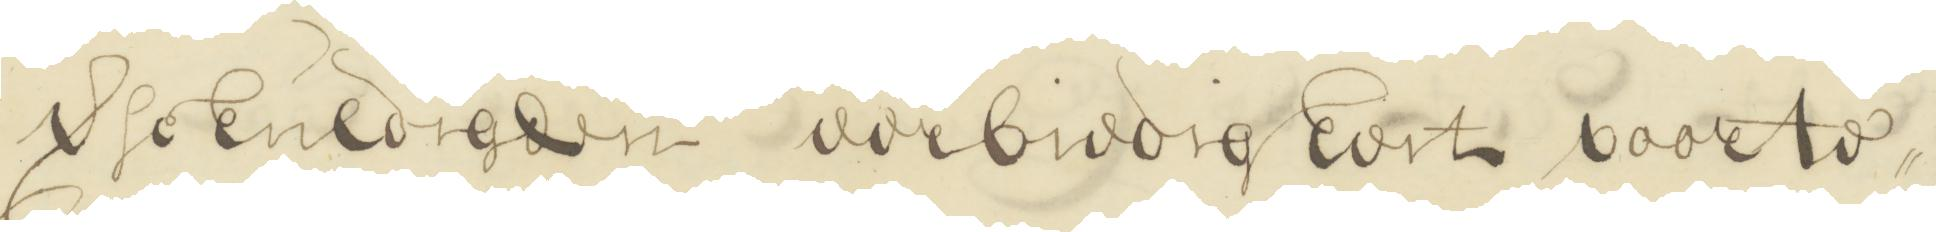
verschuldigden eerbiedigheit voor te„
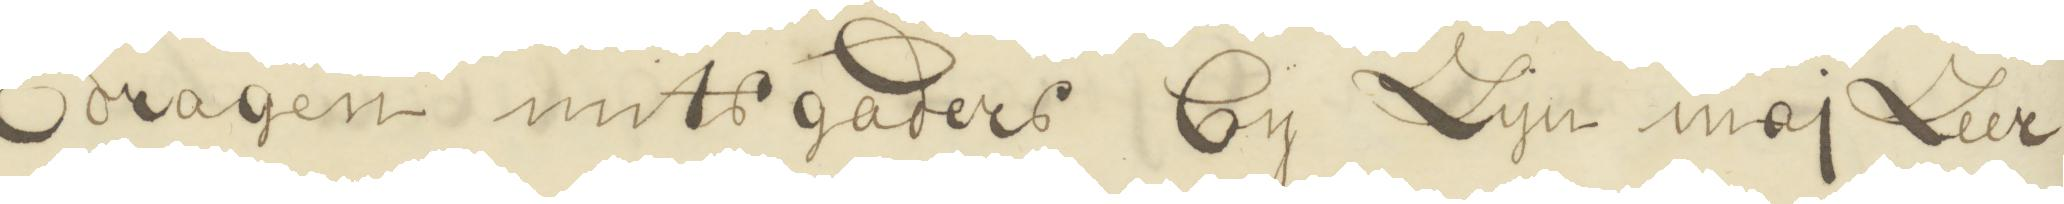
dragen mitsgaders bij Zijn maj Zeer
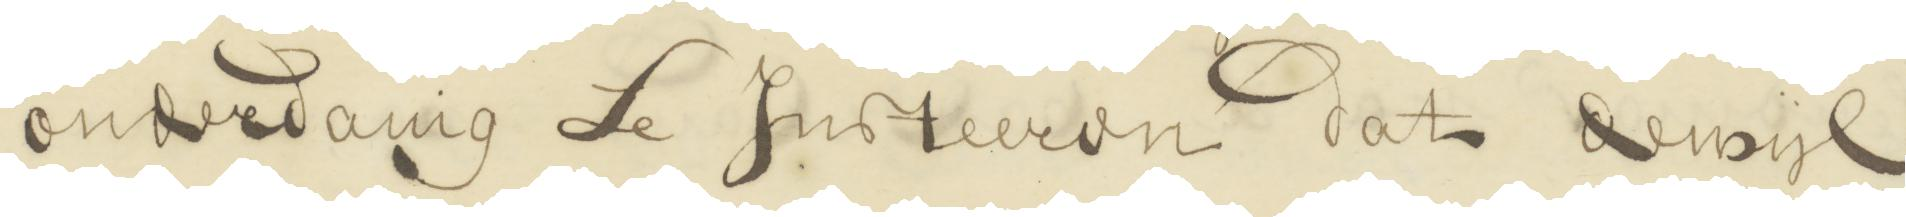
onderdanig te Jnsteeren dat dewijl
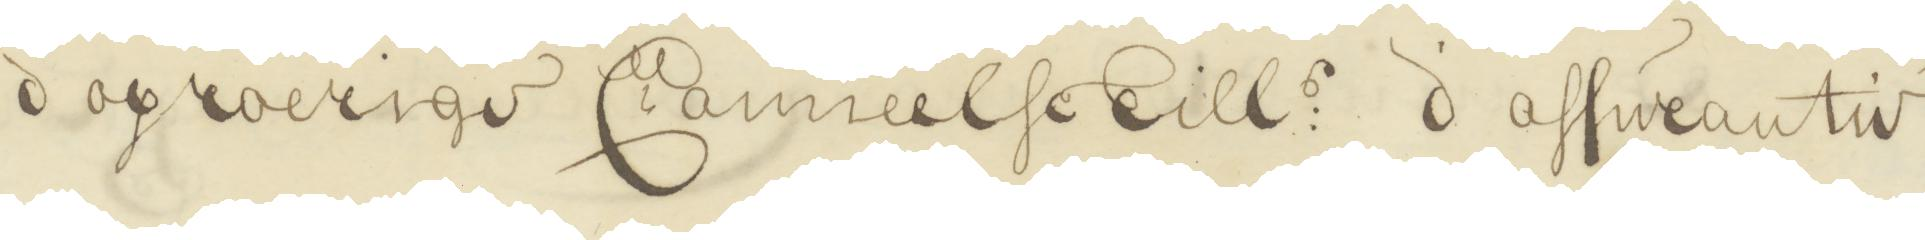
d oproerige Canneelschill:s d’assurantie
